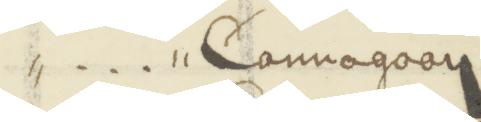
„ . . . „ Cannagooij
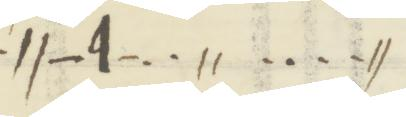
„–4 – . . „ . . . . „
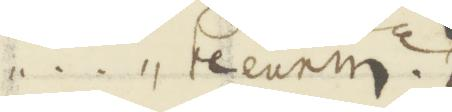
„ . . „ keurm.r
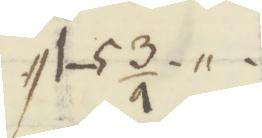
„1–5¾ - „ -
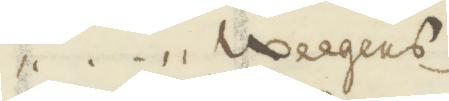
„ . - „ weegers
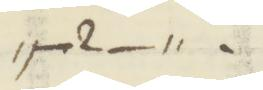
—2—„ .
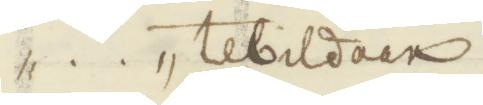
„ . . „ tebildaar
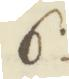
6: 4
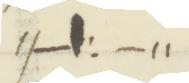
„—1: —„
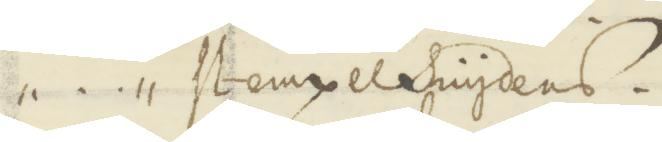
„ . . „ stempelsnijders -
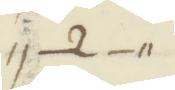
„ –2–„
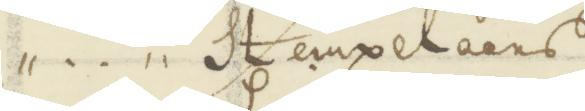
„ . . „ stempelaars
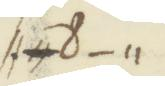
–18–„
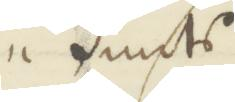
„ smits
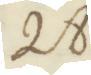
28 . 2
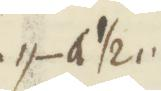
„–4½„
